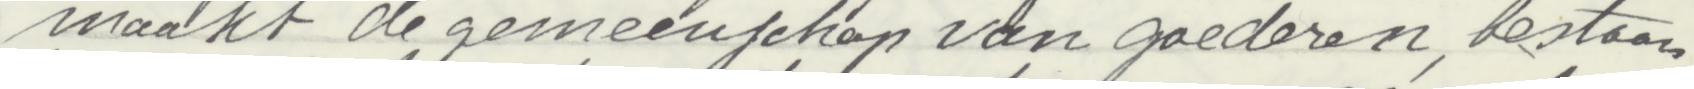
maakt de gemeenschap van goederen, bestaan
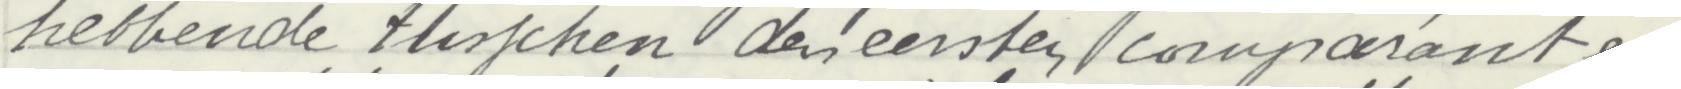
hebbende tusschen den eersten comparant en
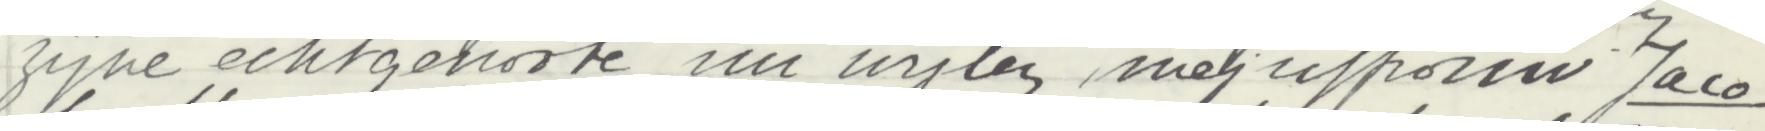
zijne echtgenoote, nu wijlen mejuffrouw Jaco
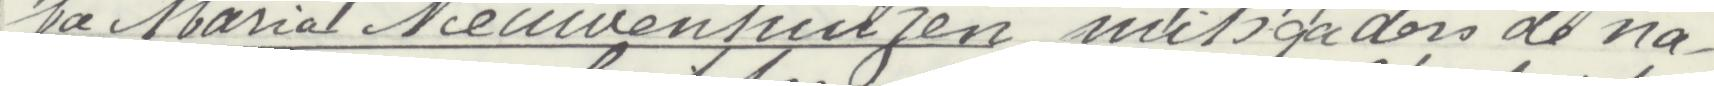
ba Maria Nieuwenhuizen, mitsgaders de na-
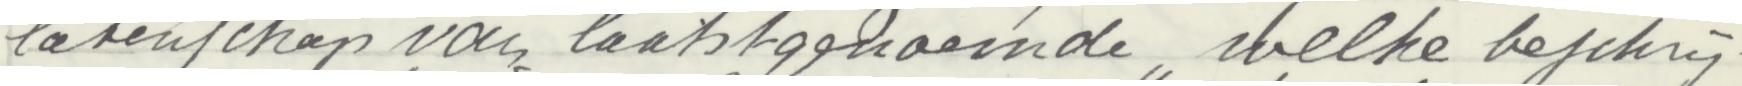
latenschap van laatstgenoemde welke beschrij
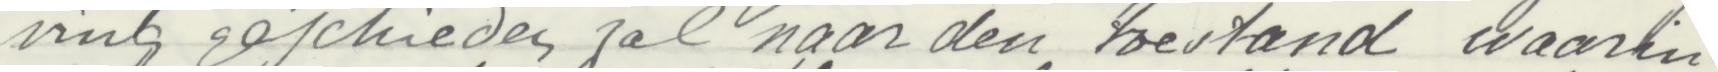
ving geschieden zal naar den toestand waarin
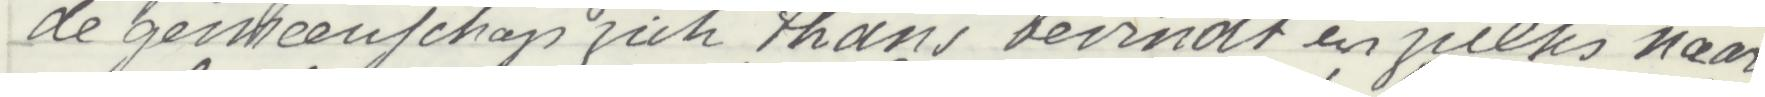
de gemeenschap zich thans bevindt en zulks naar
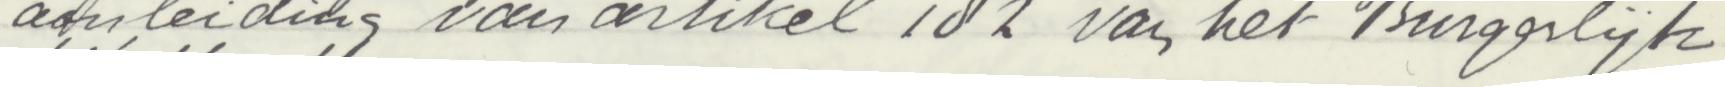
aanleiding van artikel 182 van het Burgerlijk
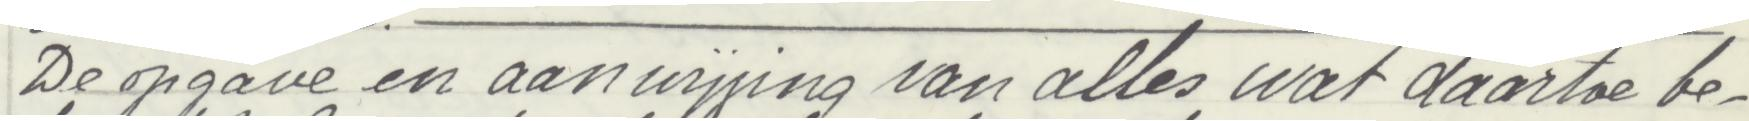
De opgave en aanwijzing van alles wat daartoe be-
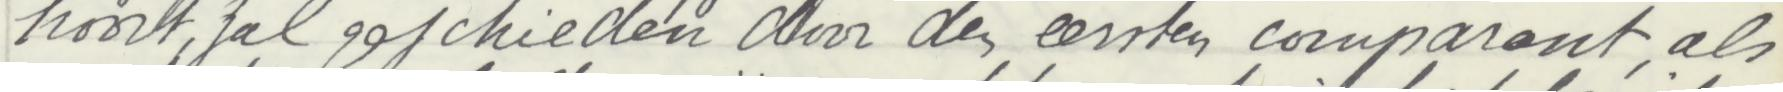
hoort, zal geschieden door den eersten comparant, als
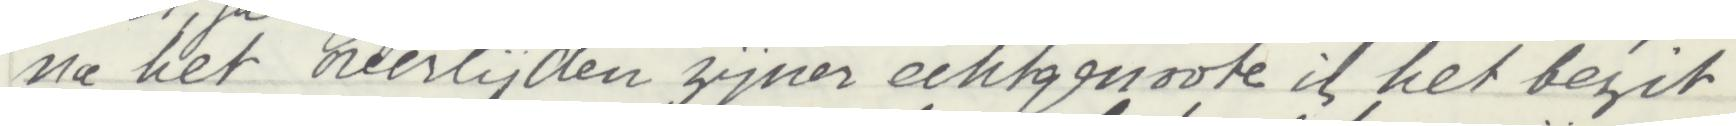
na het overlijden zyner echtgenoote in het bezit
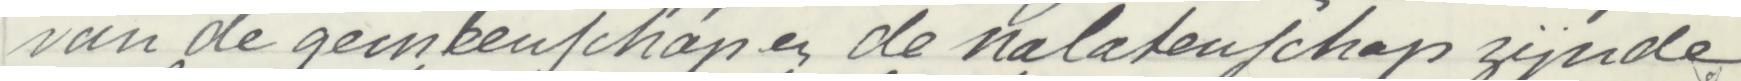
van de gemeenschap en de nalatenschap zijnde
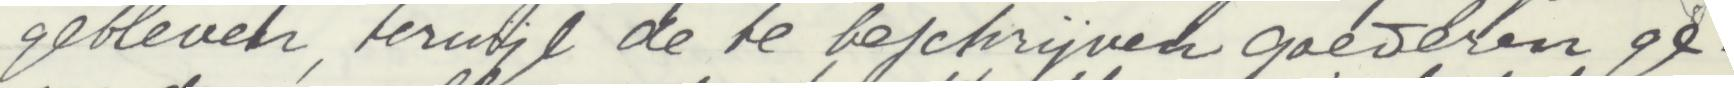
gebleven, terwijl de te beschrijven goederen ge
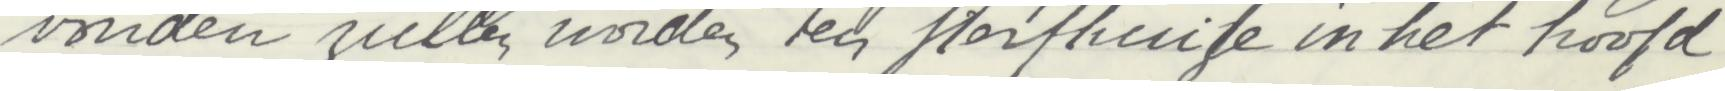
vonden zullen worden ten sterfhuize in het hoofd
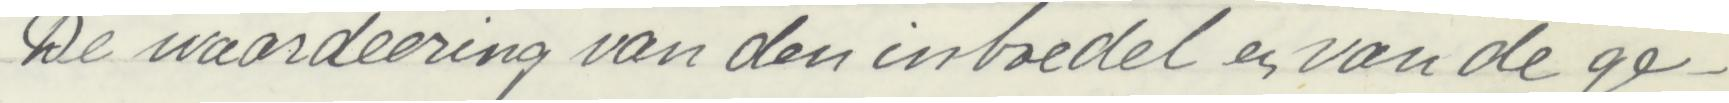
De waardeering van den inboedel en van de ge-
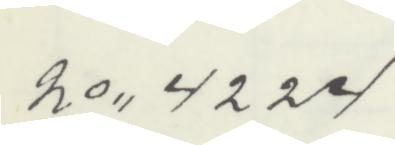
no„ 4224
